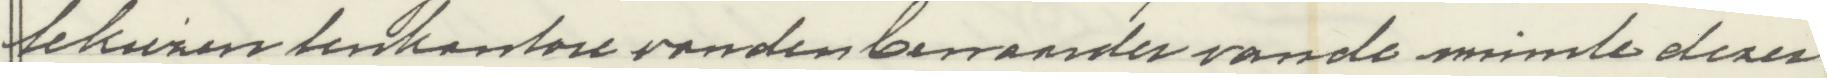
te kiezen ten kantore van den bewaarder van de minute dezer
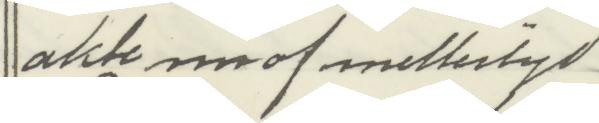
akte nu of mettertijd
